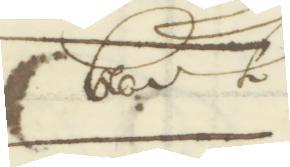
boek
